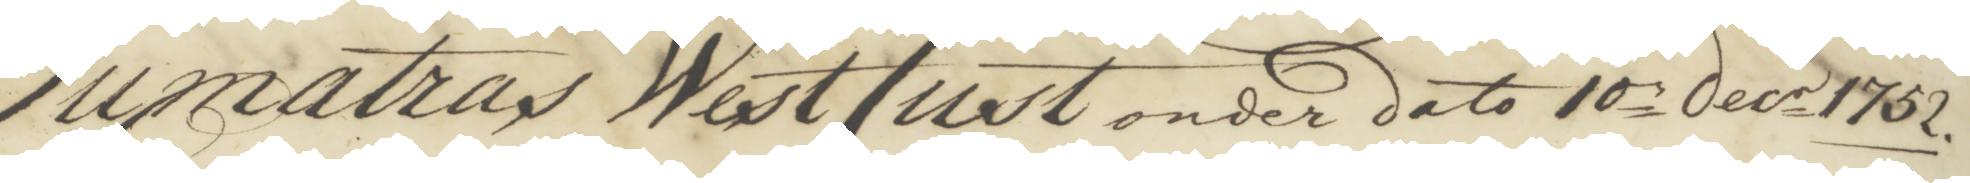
Van Sumatras West Cust onder dato 10=n dec=r 1752.
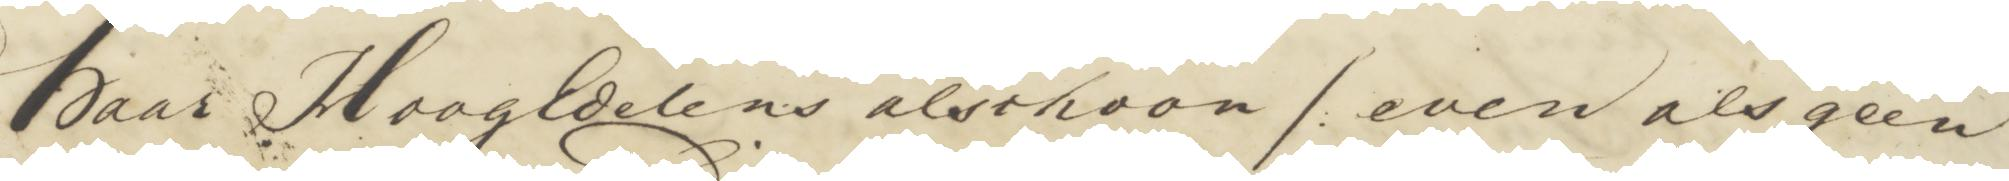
daar Hoog Edelens alschoon /: even als geen
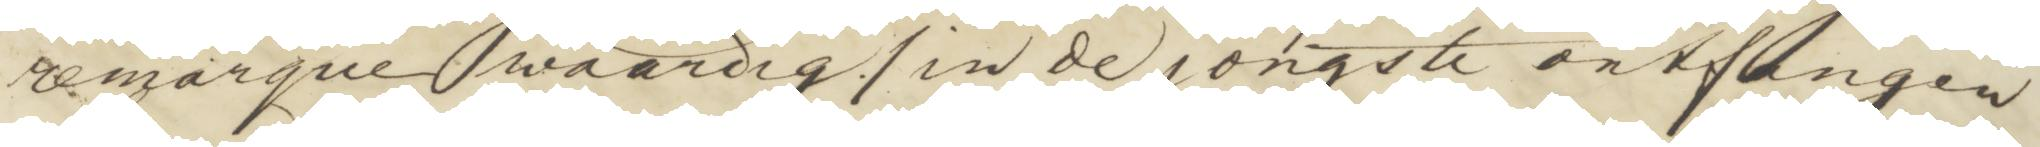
remarque waardig ./ in de jongste ontfangen
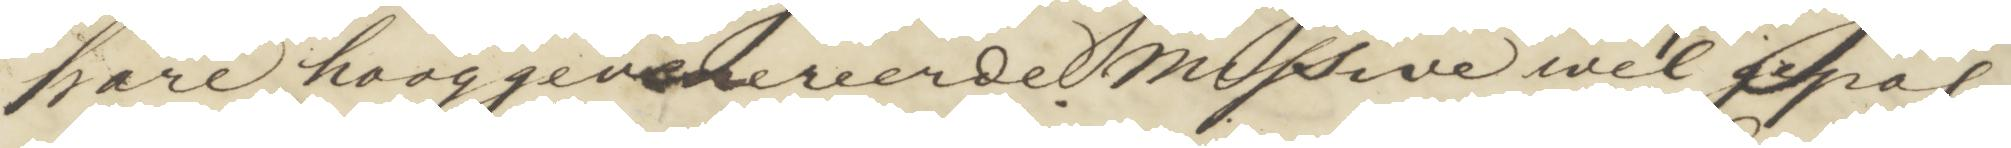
hare hooggevenereerde missive wel gepas
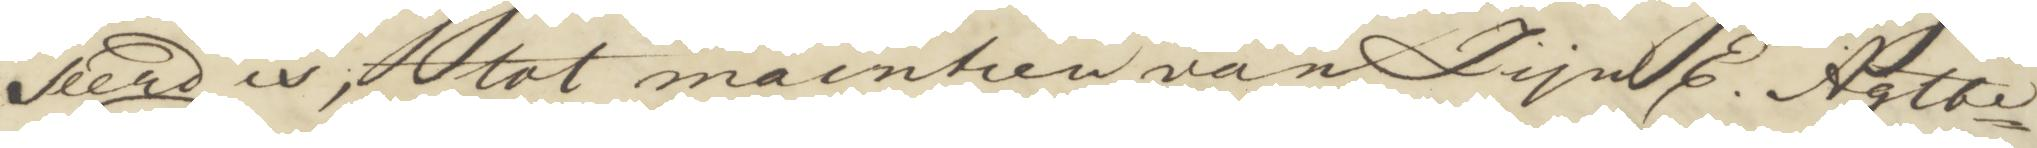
seerd is, tot maintien van Zijn E. Agtb=e
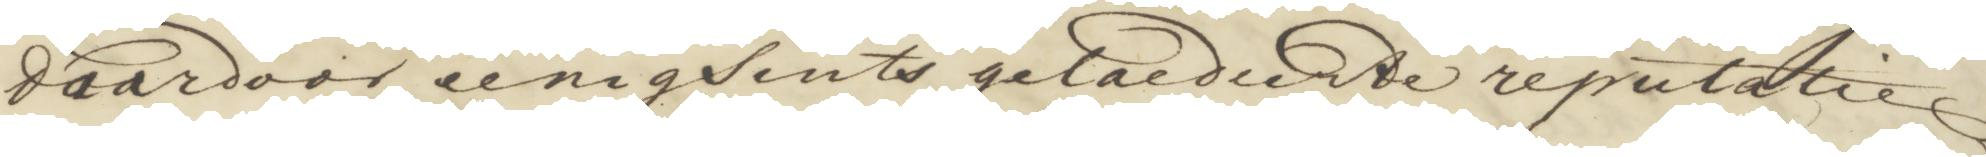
daardoor eenigsints gelaedeerde reputatie
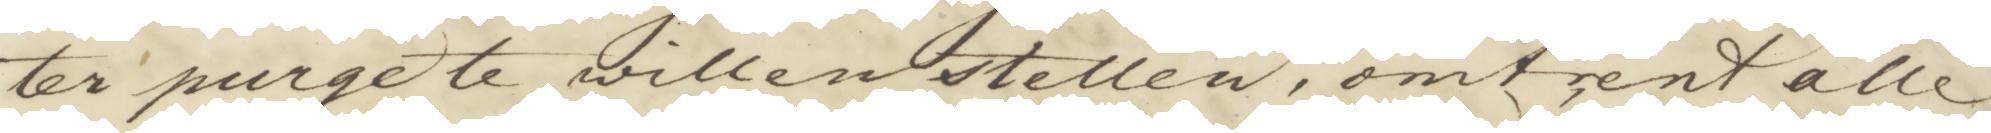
ter purge te willen stellen, omtrent alle
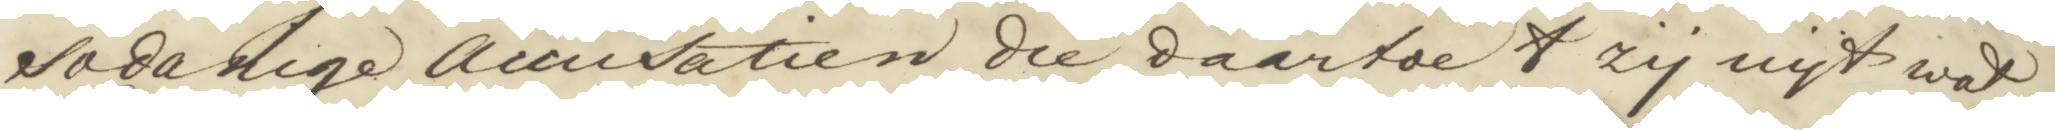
sodanige accusatien die daartoe ’t zij uijt wat
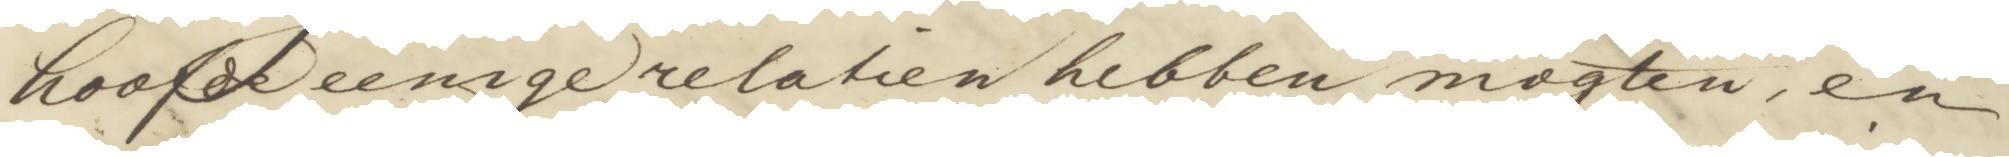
hoofde eenige relatien hebben mogten, en
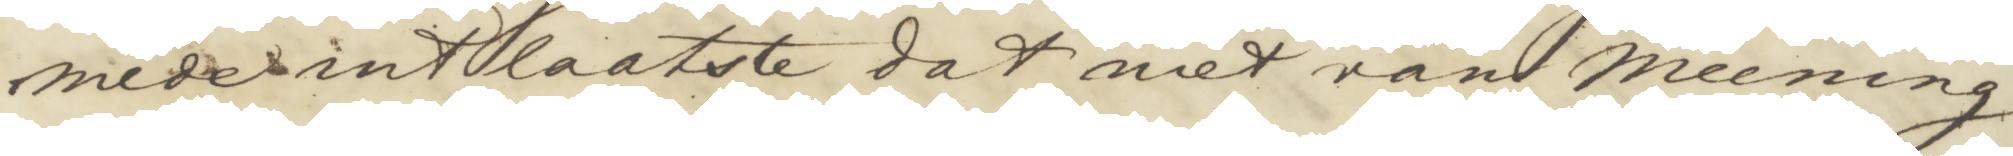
mede int laatste dat niet van meening
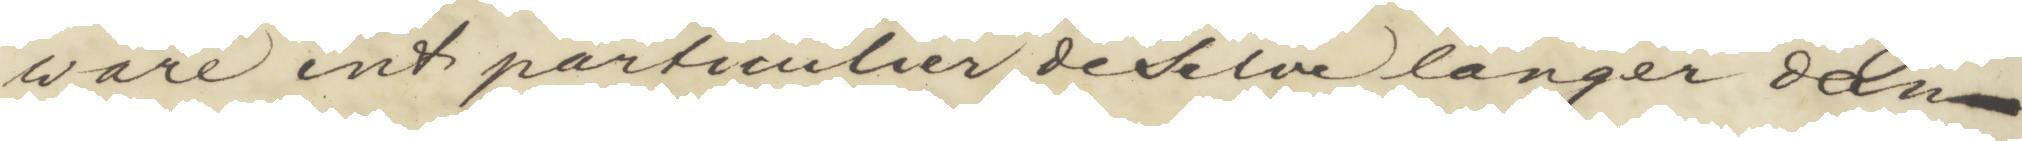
ware int particulier, deselve langer dan
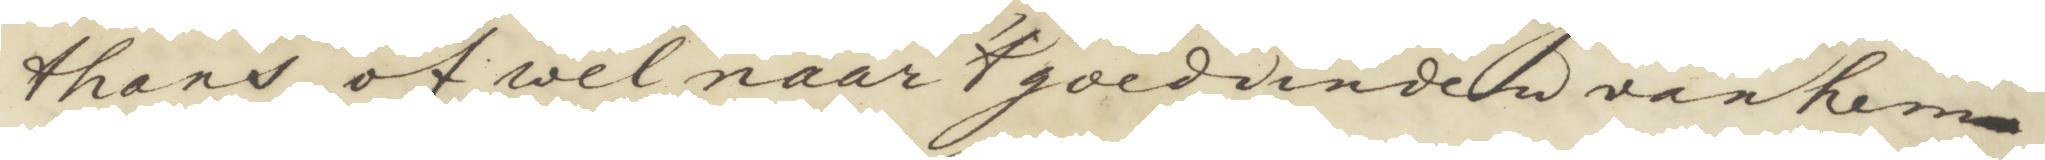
thans, of wel naar ’t goedvinden van hem
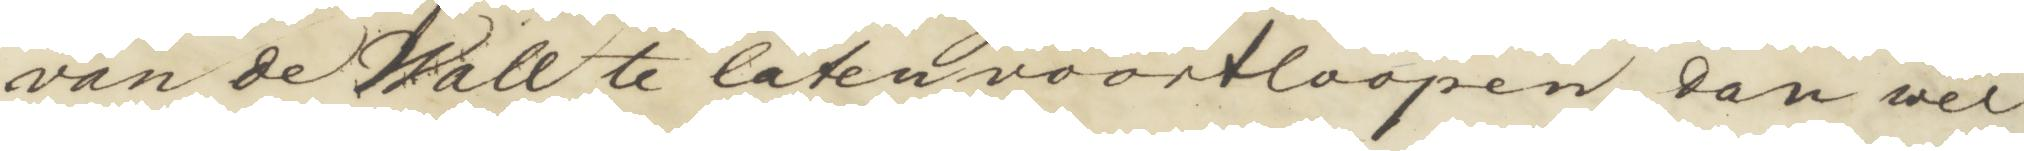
van de Wall te laten voortloopen, dan wel
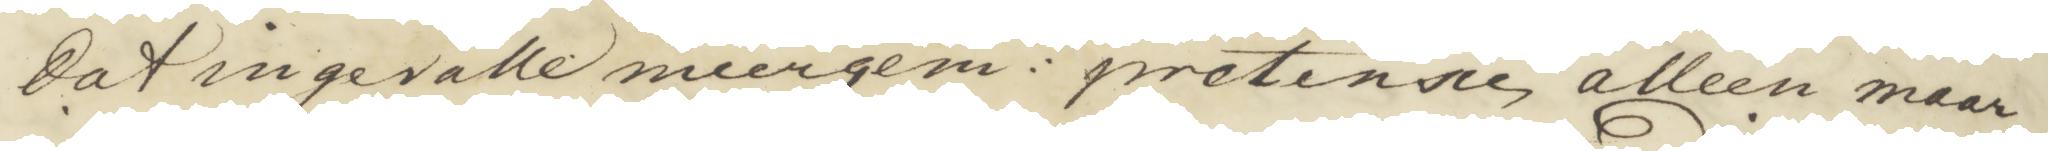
dat in gevalle meergem: pretensie alleen maar
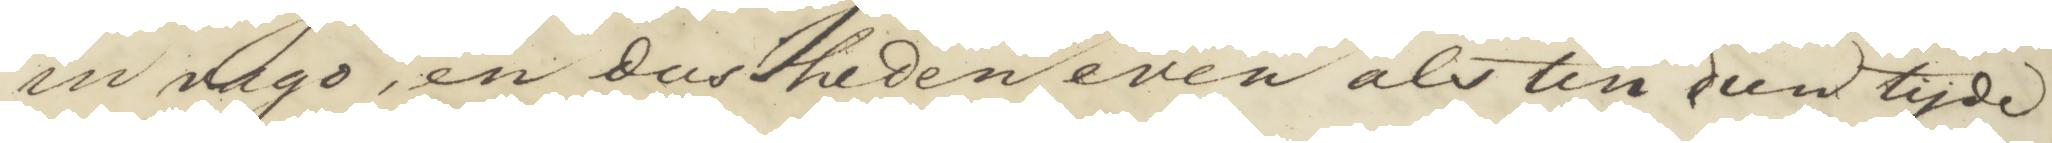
in vago, en dus heden even als ten dien tijde
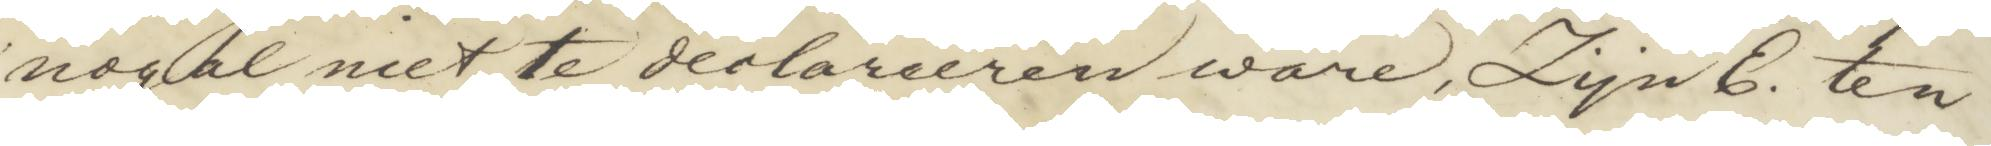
nog al niet te declareeren ware, zijn E. ten
